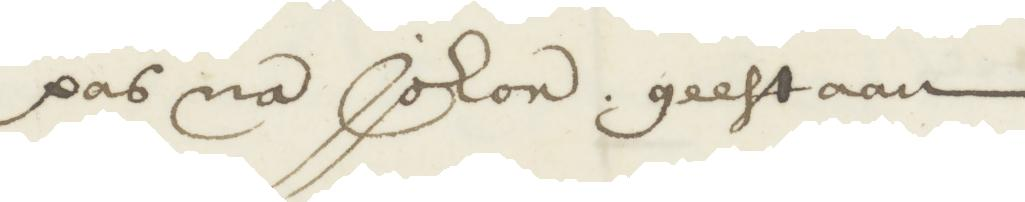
pas na johor. geeft aan
